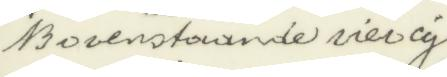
Bovenstaande vier cij
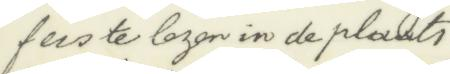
fers te lezen in de plaats
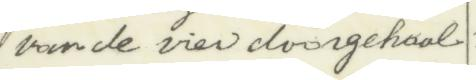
van de vier doorgehaal-
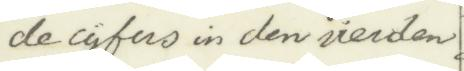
de cijfers in den vierden
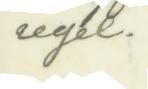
regel.
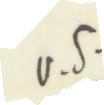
v.d
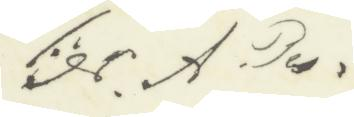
N. A. R
